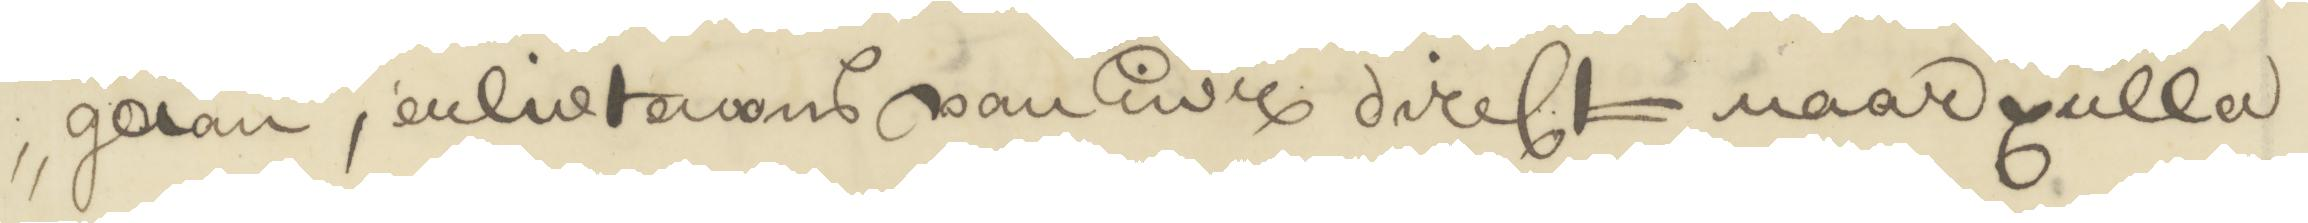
„gaan, en lietavons van hier direct naar xulla
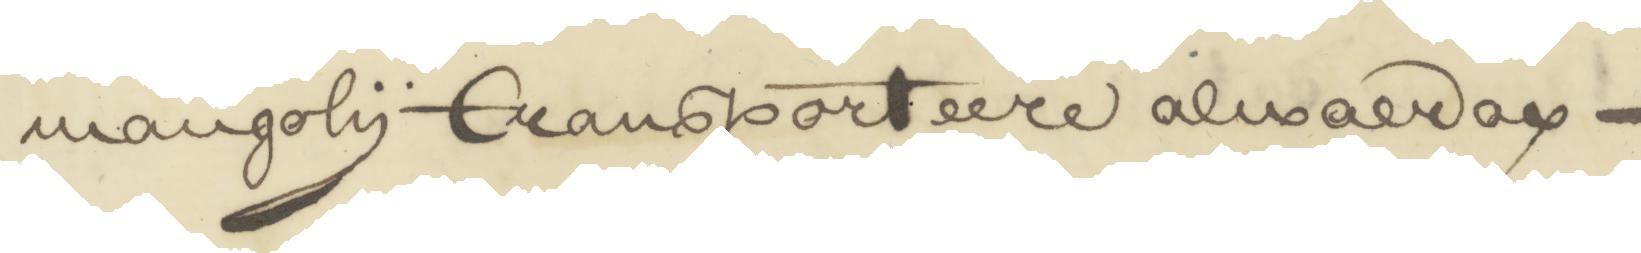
mangolij transporteere alwaer op -
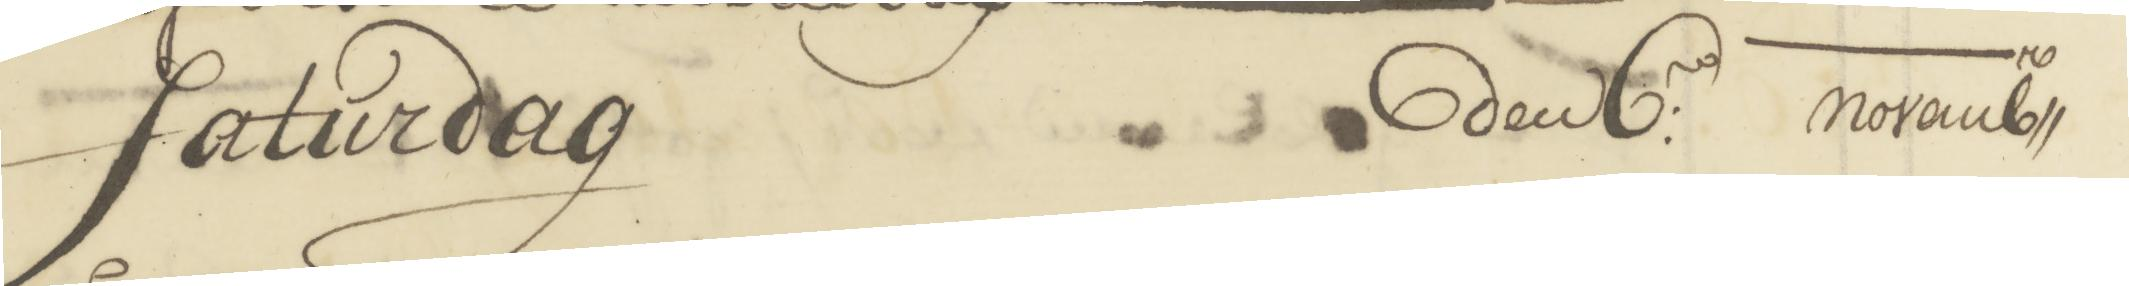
saturdag den 6: enovemb„r
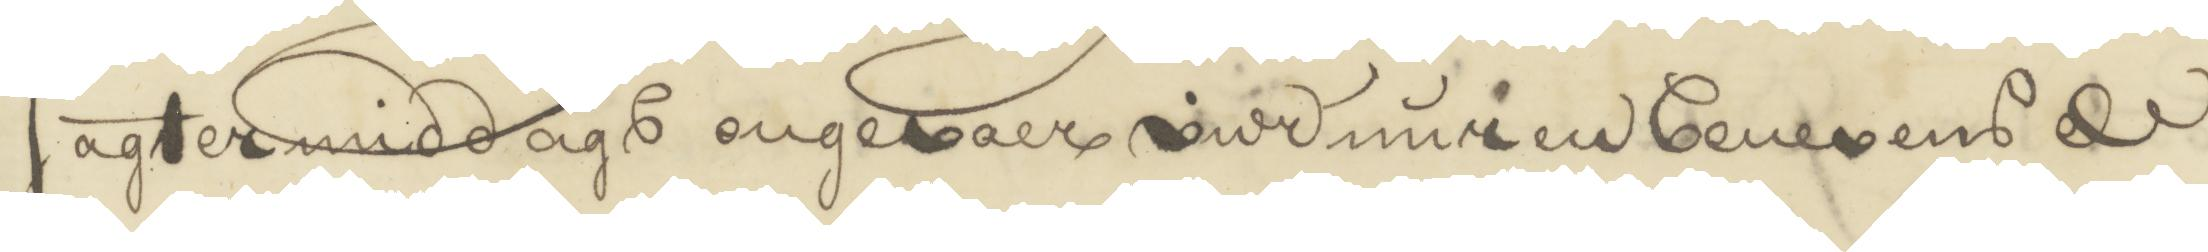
s'agter middags ongevaer vier uur en benevens de
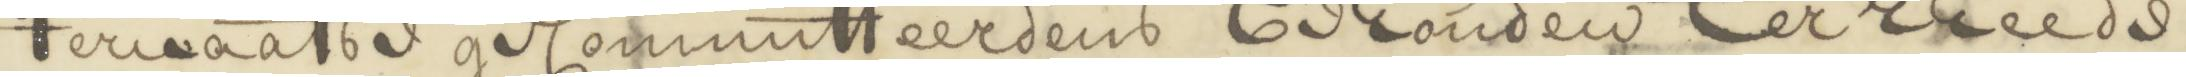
ternaatse gecommitteerdens behouden ter rheede
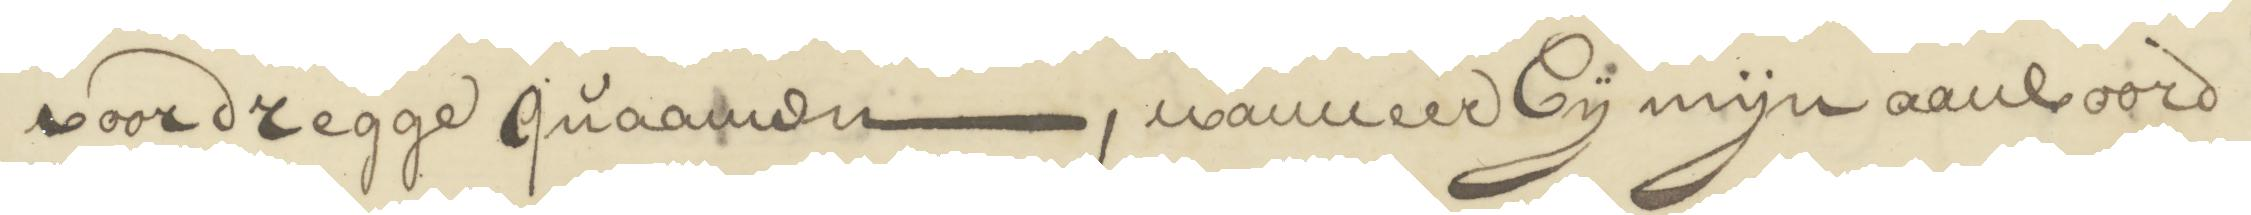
voor dregge quaamen, wanneer bij mijn aanboord
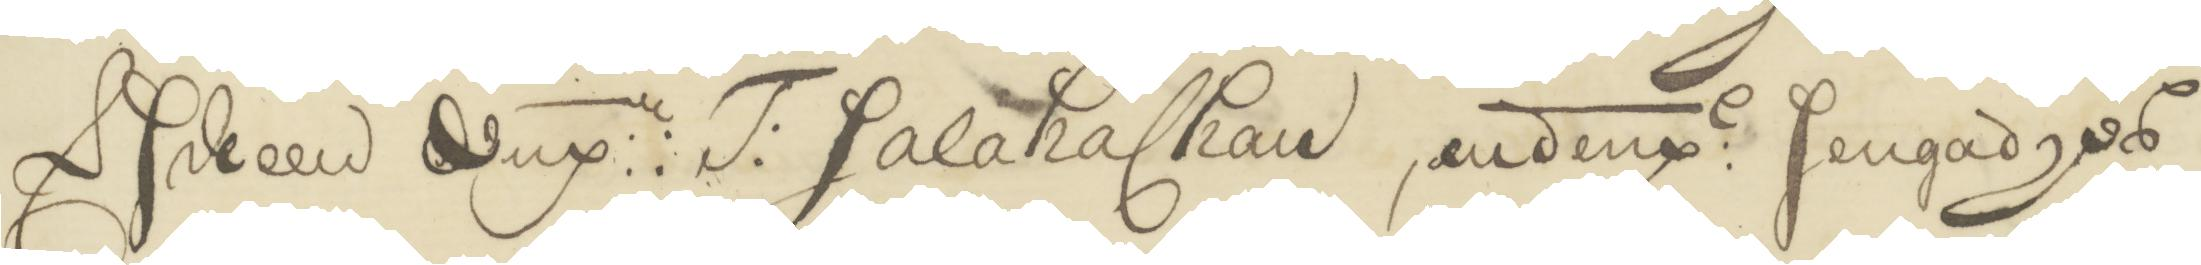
verscheen den p:r: T: salahachan, en denp:l sengadjes
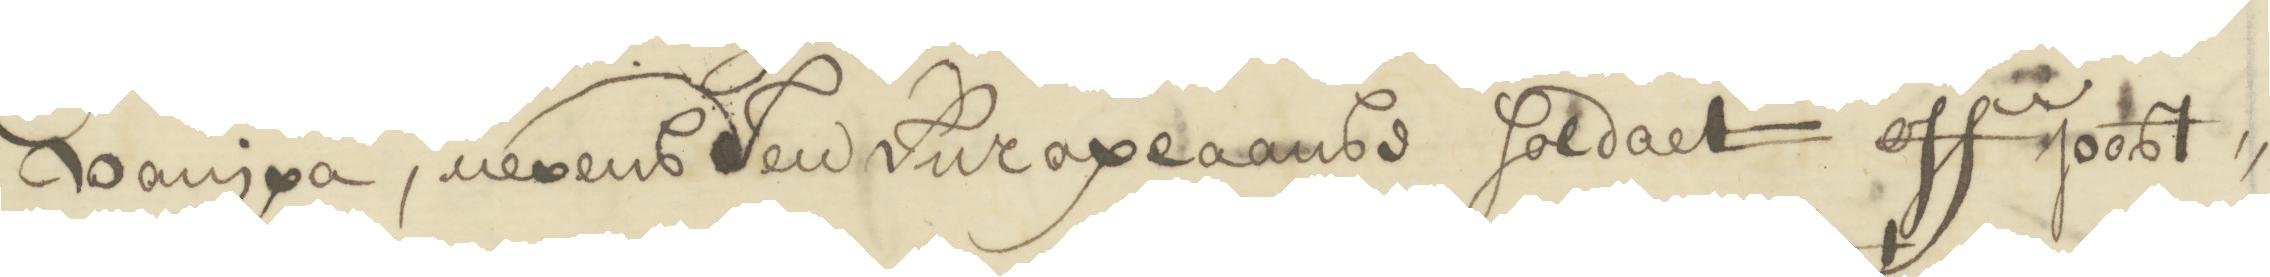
vanjpa, nevens Een Europeaanse soldaet off post„
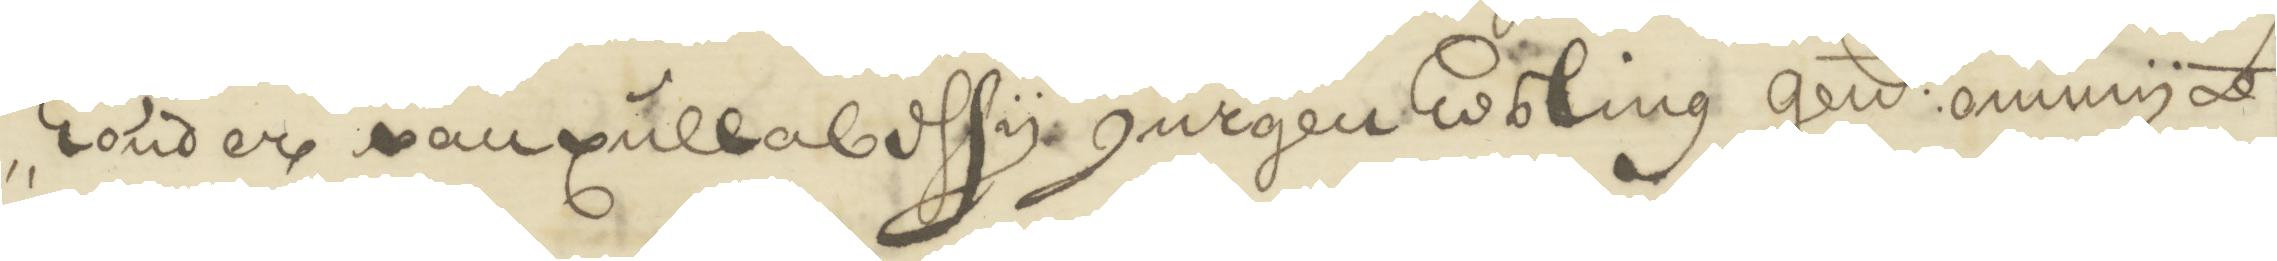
„houder van xullabessij jurgen hesling gen:t ommij te
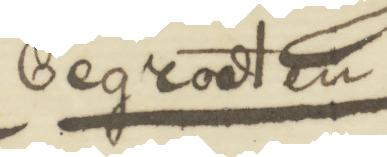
begroeten
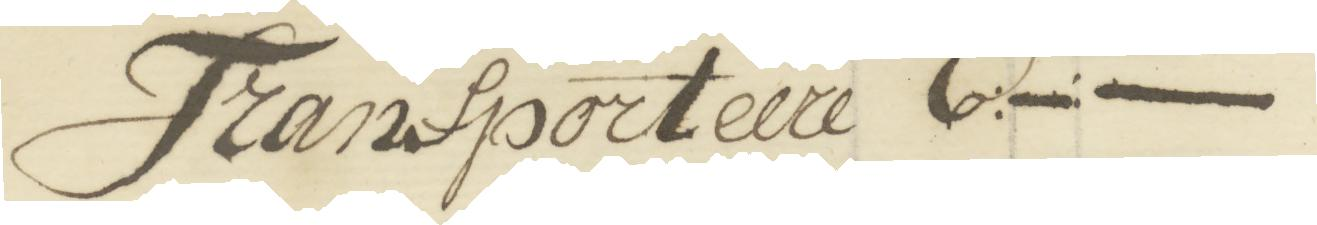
Transporteere 6:—:—
